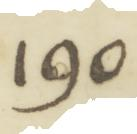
190
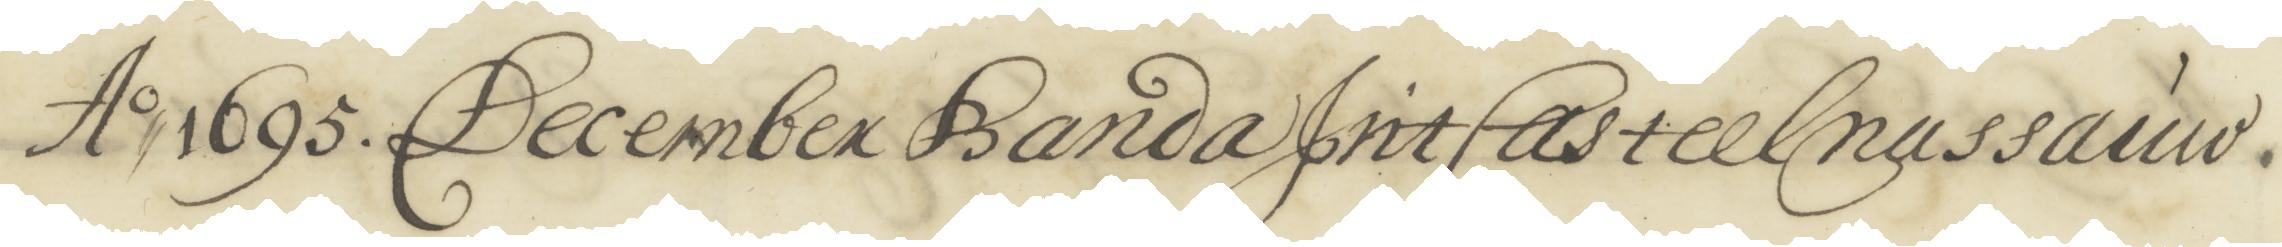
A„o 1695. December Banda Jn't Casteel nassauw.
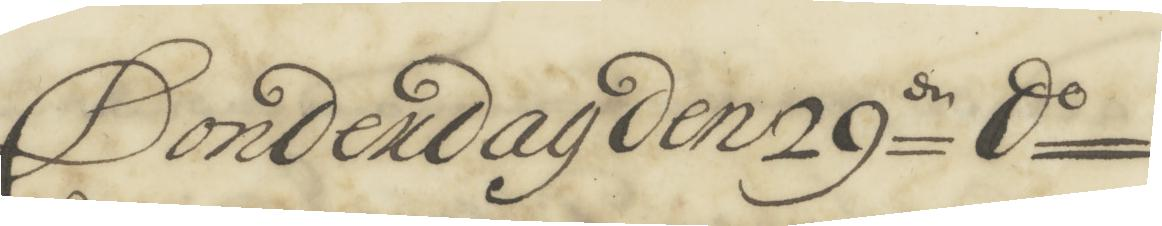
Donderdag den 29=en d=o
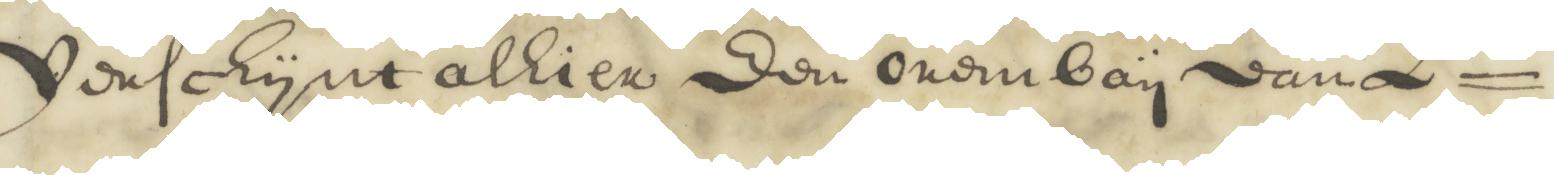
verschijnt alhier Een orembaij van P=lo
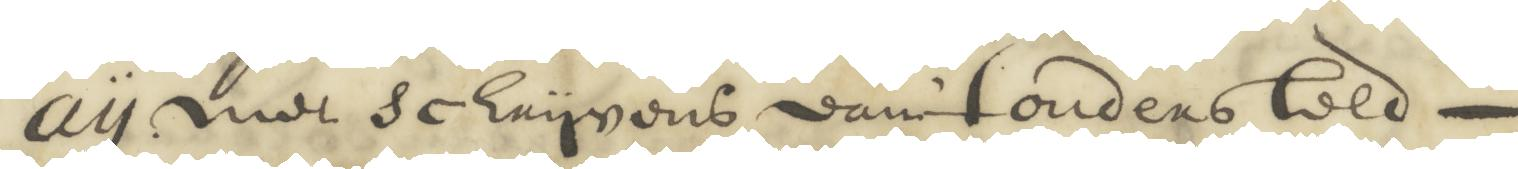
aij met schrijvens van ’t ondersteld —
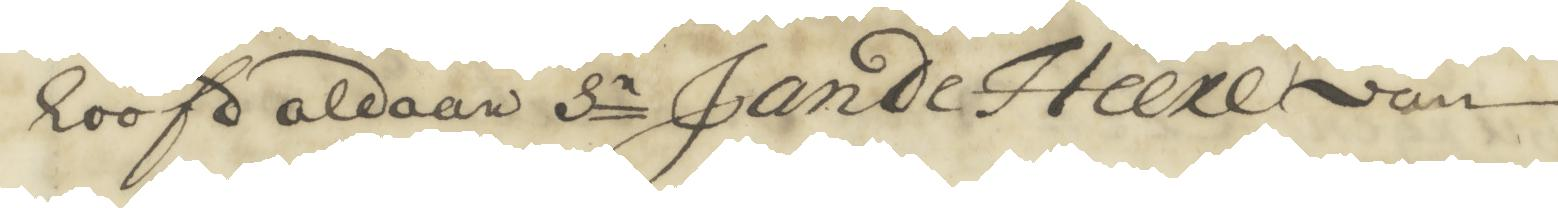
hoofd aldaar s=r Jan de Heere van
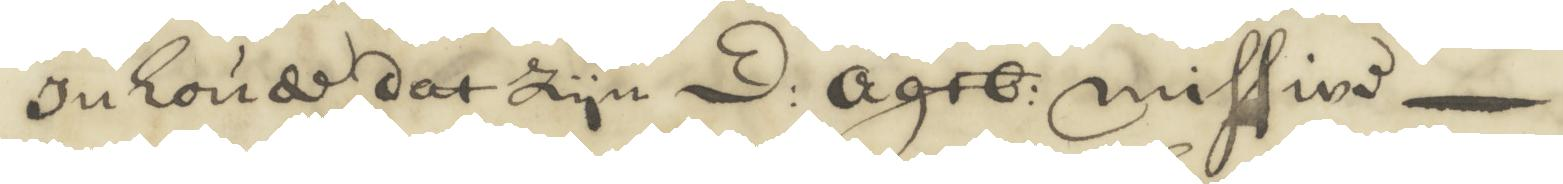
In houde dat zijn E: agtb: missive —
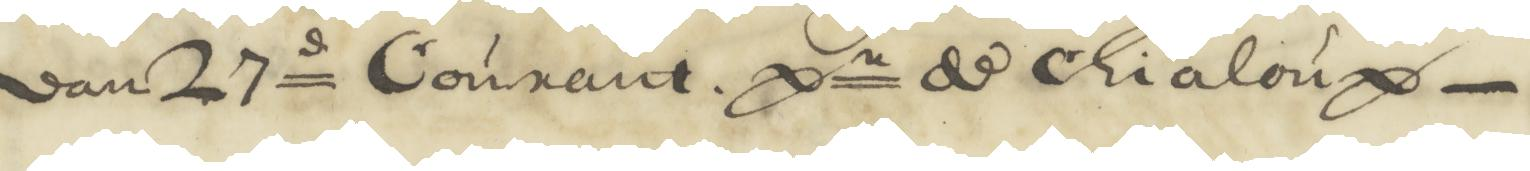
van 27=e Courant. p=r de chialoup —
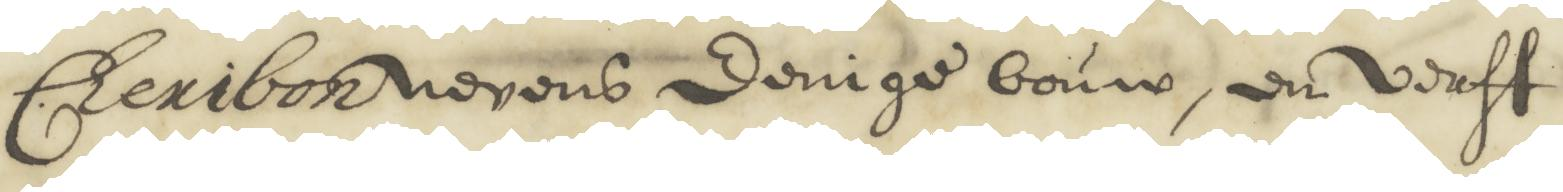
Cheribon nevens Eenige bouw, en verff
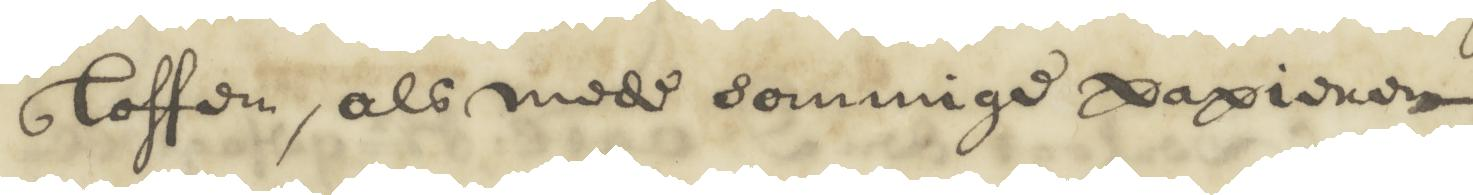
stoffen, als mede sommige papieren
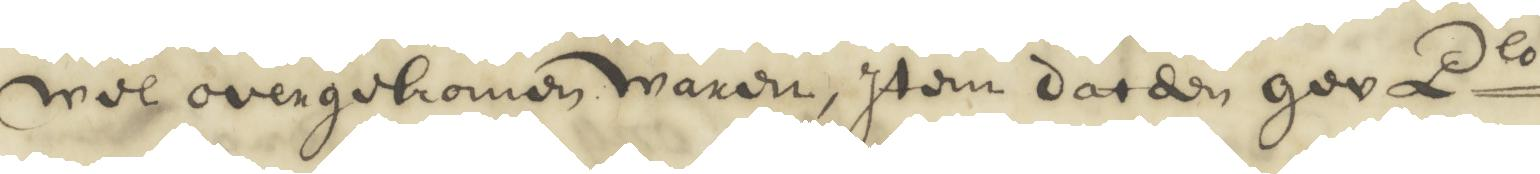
wel overgekomen waren, Item dat den gev P=lo
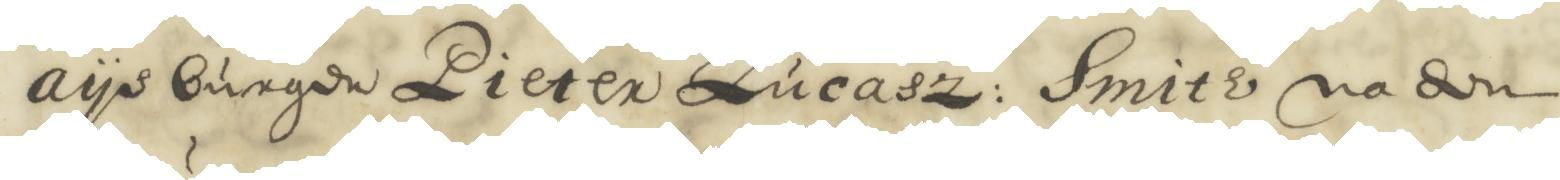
aijs burger Pieter Lucasz: smith na den
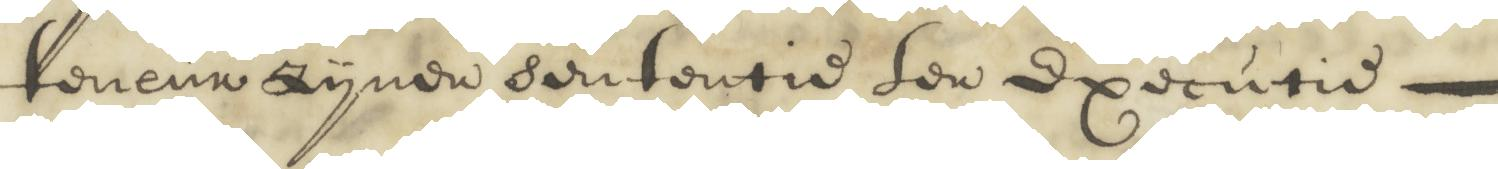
teneur zijner sententie ter executie —
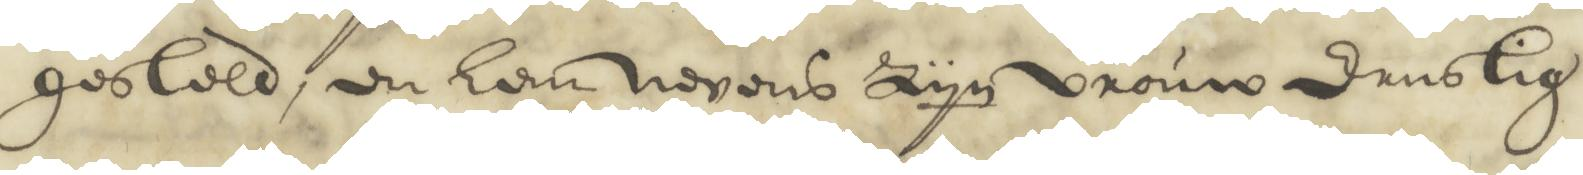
gesteld, en hem nevens zijn vrouw Ernstig
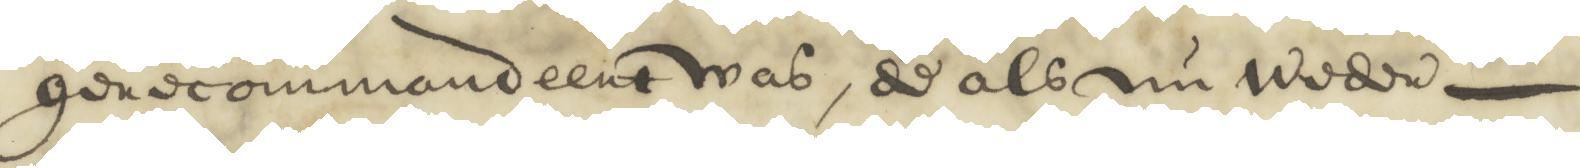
gerecommandeert was, de als nu weder —
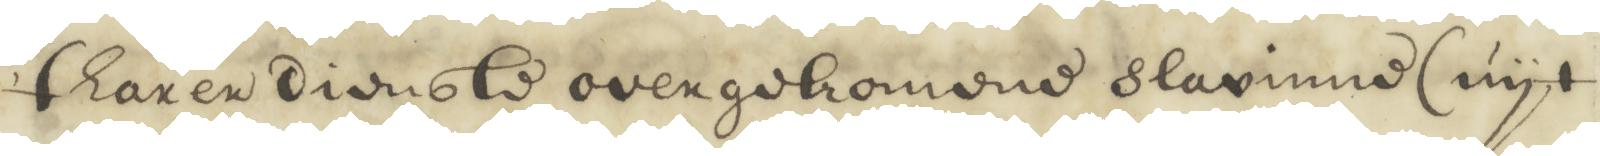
't harer dienste overgekomene slavinne (uijt
